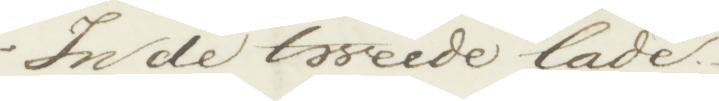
In de tweede lade.
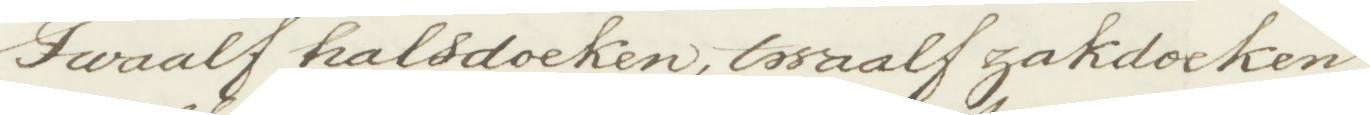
Twaalf halsdoeken, twaalf zakdoeken,
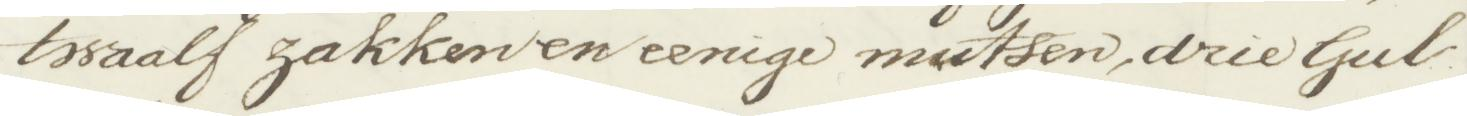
twaalf zakken en eenige mutsen, drie Gul„
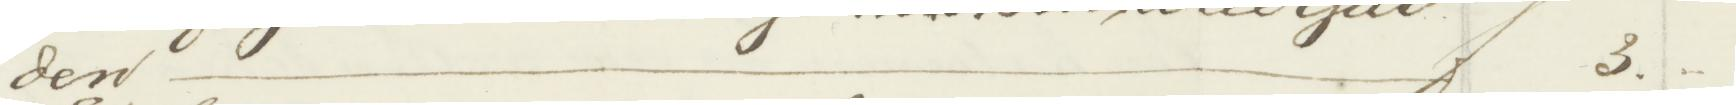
den — ƒ 3. „
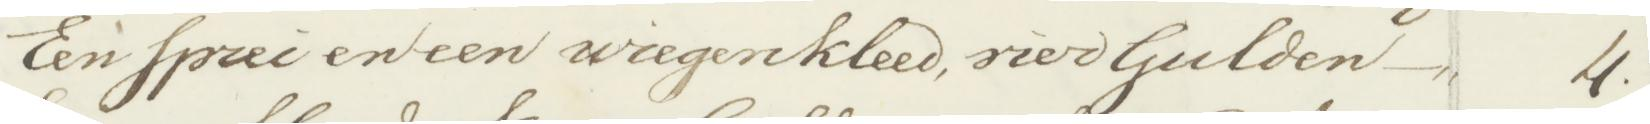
Een sprei en een wiegenkleed, vier Gulden—„ 4.
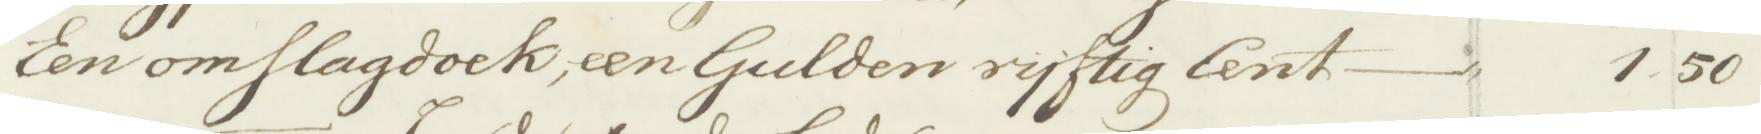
Een omslagdoek, een Gulden vijftig Cent—„ 1,50
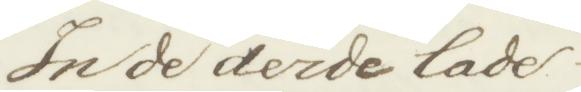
In de derde lade
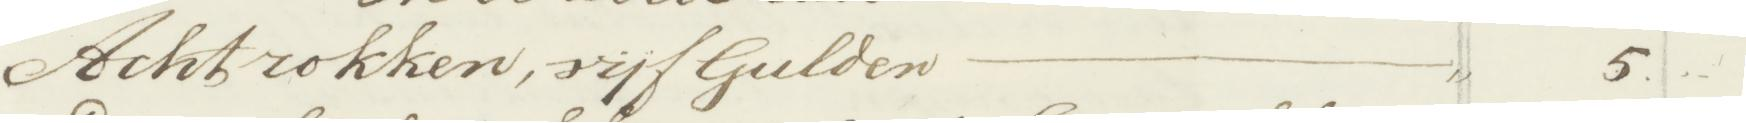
Acht rokken, vijf Gulden —„ 5.„
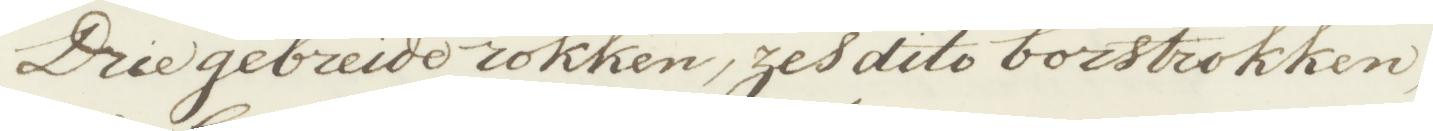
Drie gebreide rokken, zes dito borstrokken,
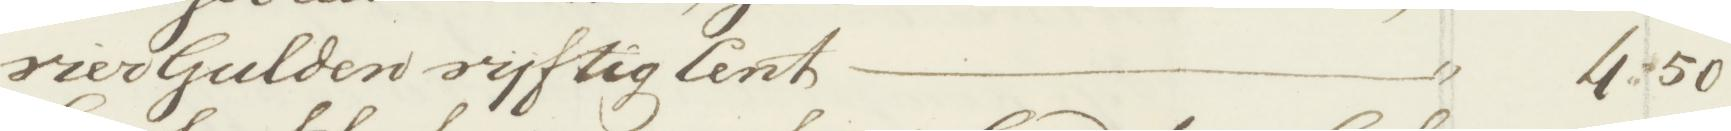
vier Gulden vijftig Cent — 4„50
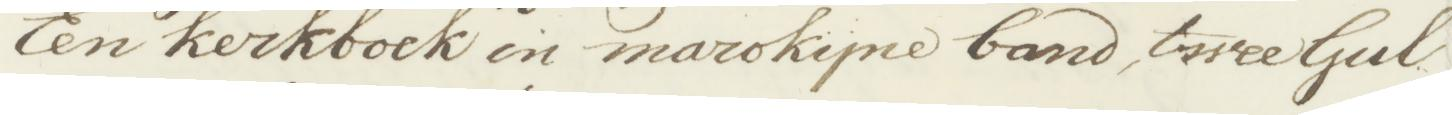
Een kerkboek in marokijne band, twee Gul„
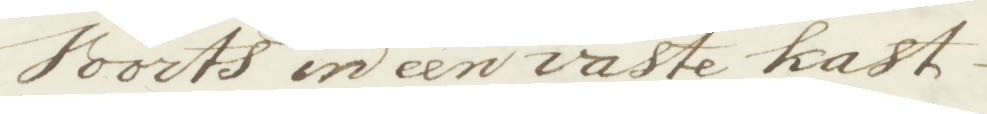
Voorts in een vaste kast-
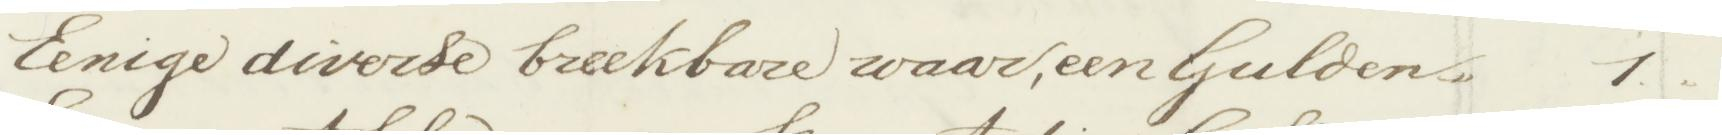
Eenige diverse breekbare waar, een Gulden„ 1.„
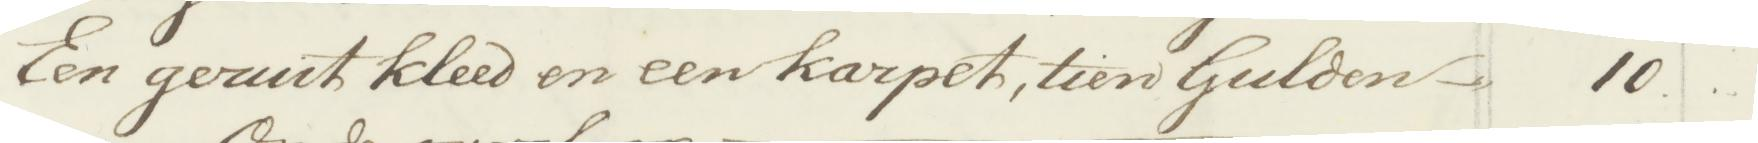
Een geruit kleed en een karpet, tien Gulden-„ 10.„
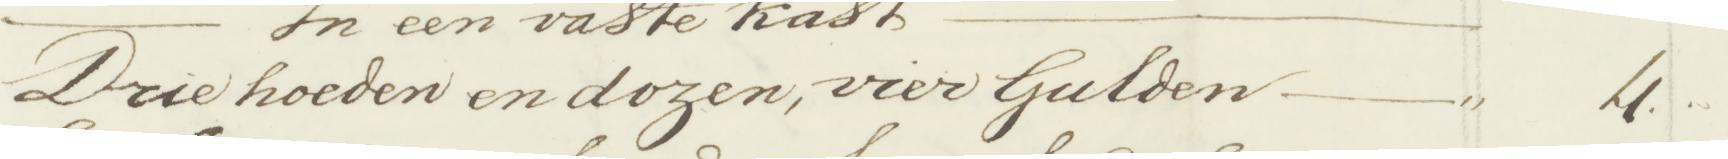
Drie hoeden en dozen, vier Gulden—„ 4.„
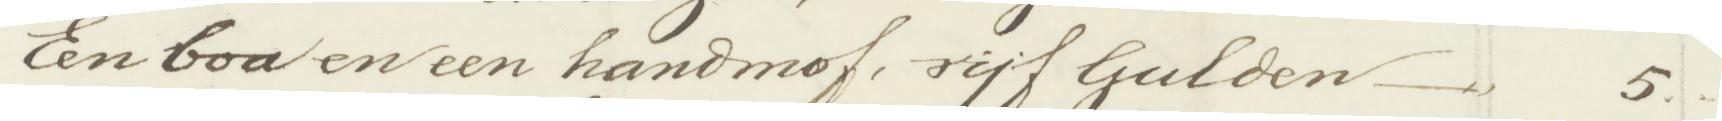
Een boa en een handmof, vijf Gulden 5.
